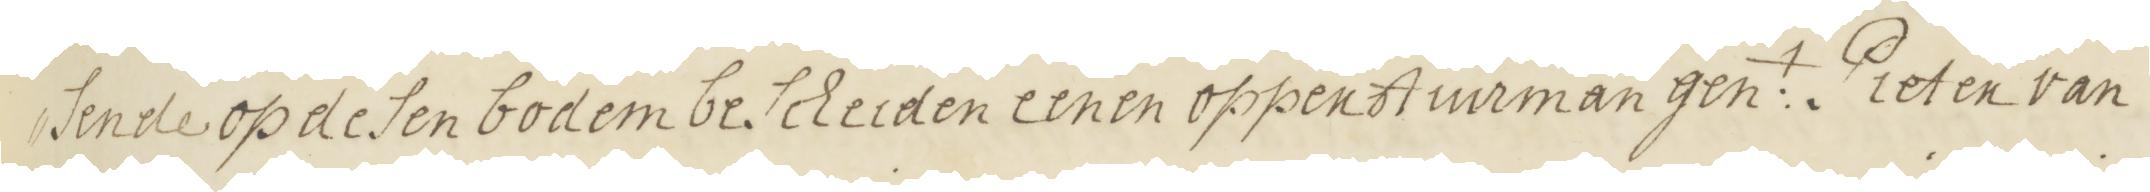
„sende op desen bodem bescheiden eenen opperstuirman gen:t Pieter van
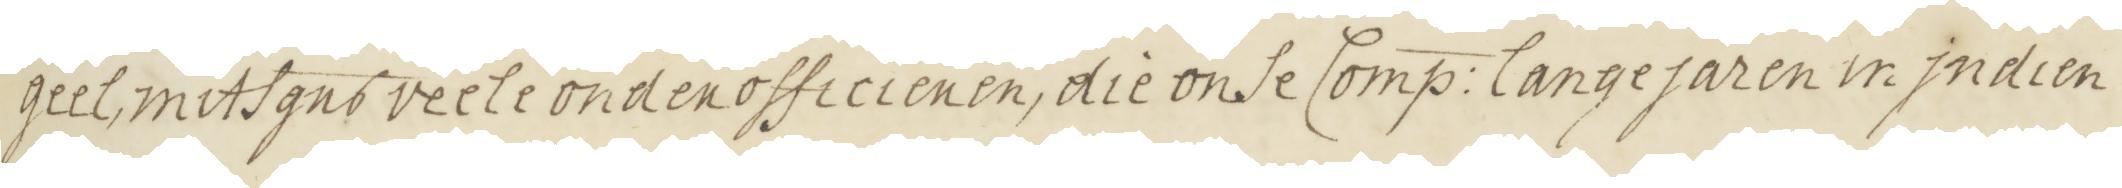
geel, mitsgrs veele onderofficieren, die onse Comp: lange jaren in Indien
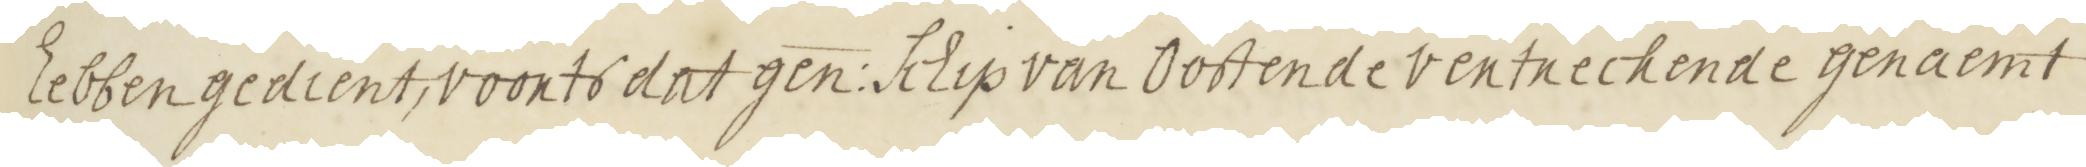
hebben gedient, voorts dat gen: schip van Oostende vertreckende genaemt
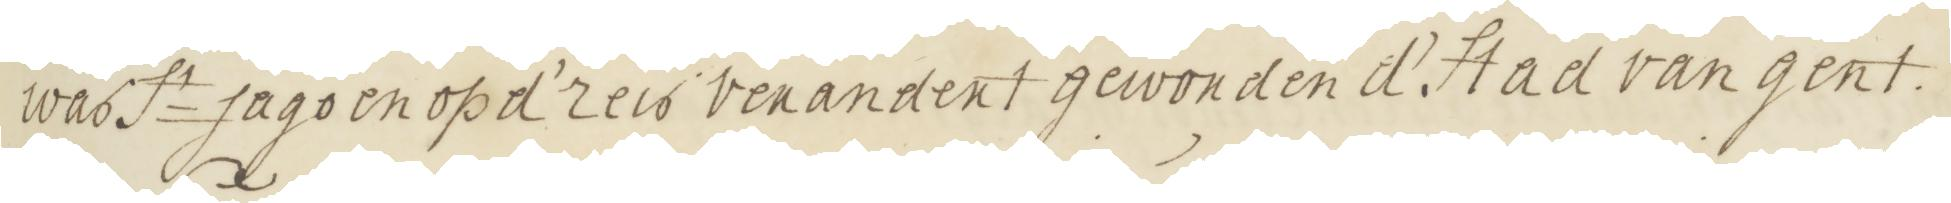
was s=t Jago en op d'reis verandert geworden d' stad van gent.
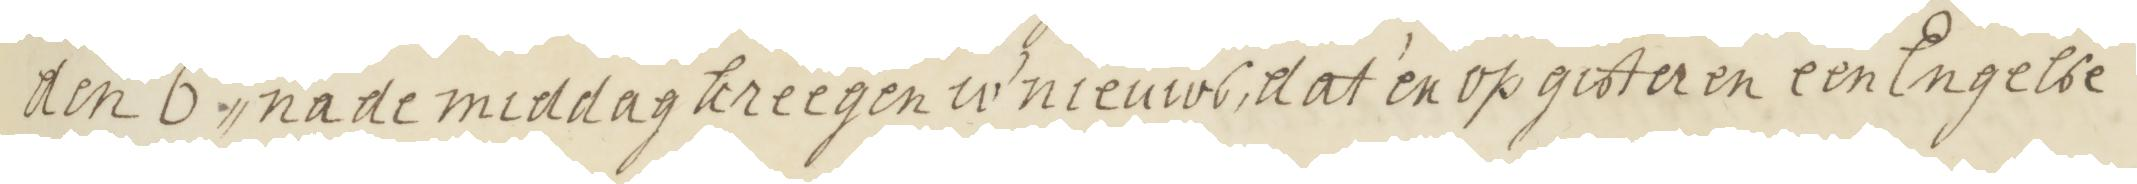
den 6„e nade middag kreegen w' nieuw, dat 'er op gisteren een Engelse
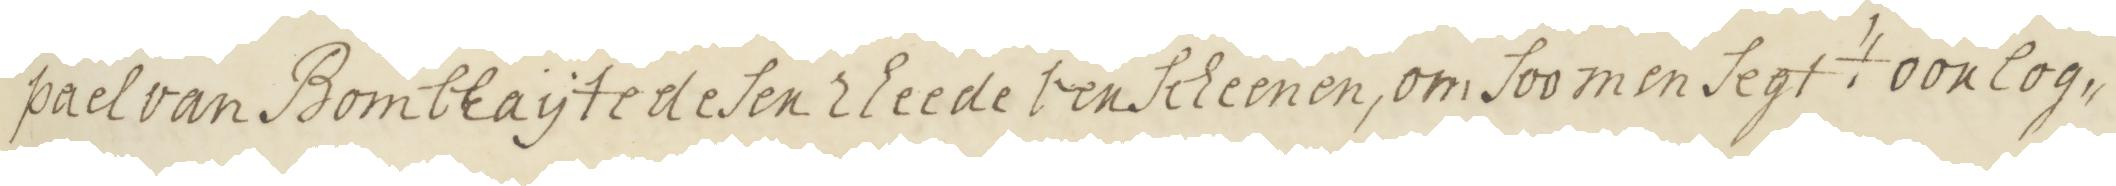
pael van Bomblaijte deser Rheede verscheenen, om soo men segt 't oorlog„
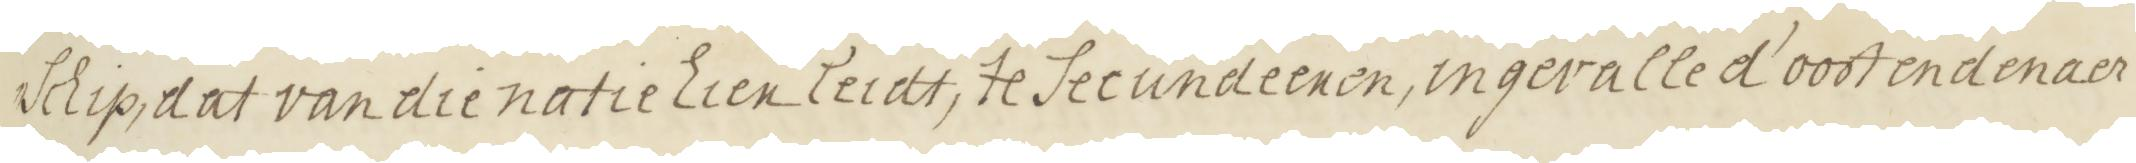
schip, dat van die natie hier leidt, te secundeeren, in gevalle d'oost en denaer
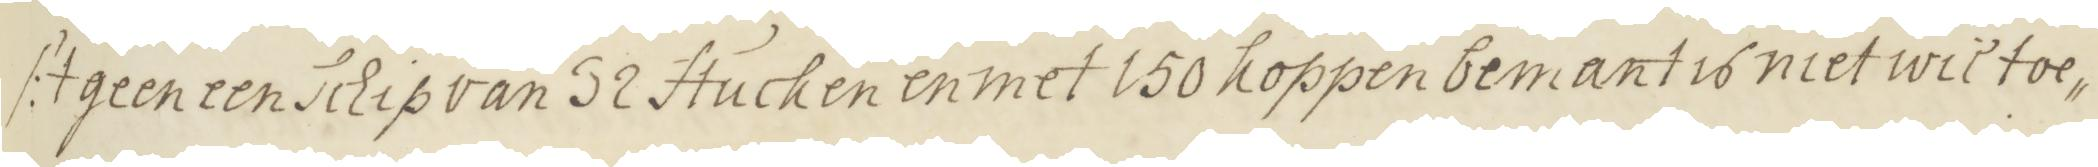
/: ’t geen een schip van 32 stucken en met 150 koppen bemant is niet wil toe„
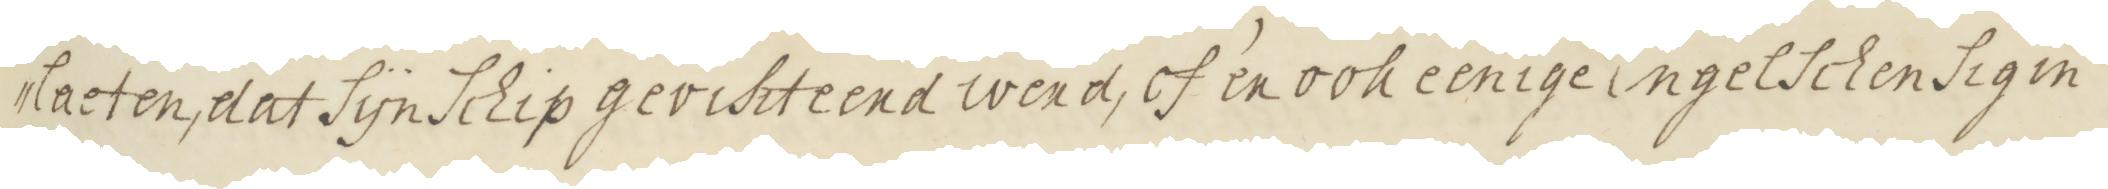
„lacten, dat sijn schip gevisiteerd werd, of 'er ook eenige Engelschen sig in
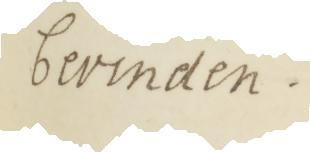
bevinden.
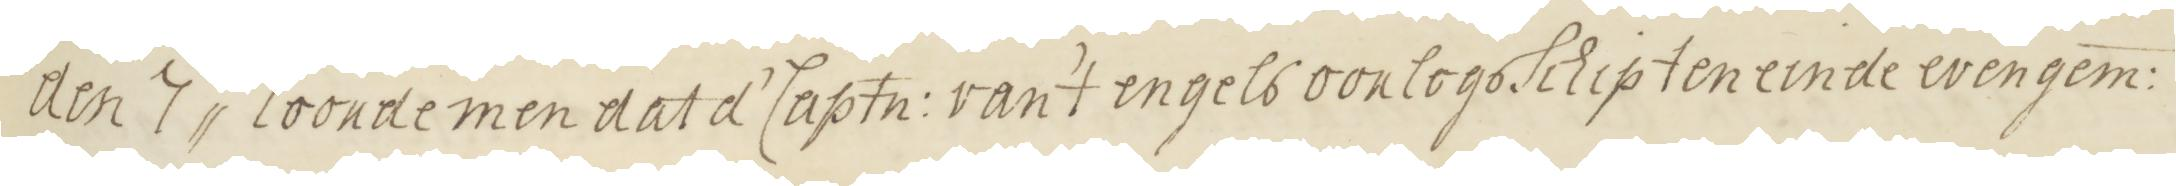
den 7„e hoorde men dat d' Captn: van ’t engels oorlogsschip ten einde evengem:
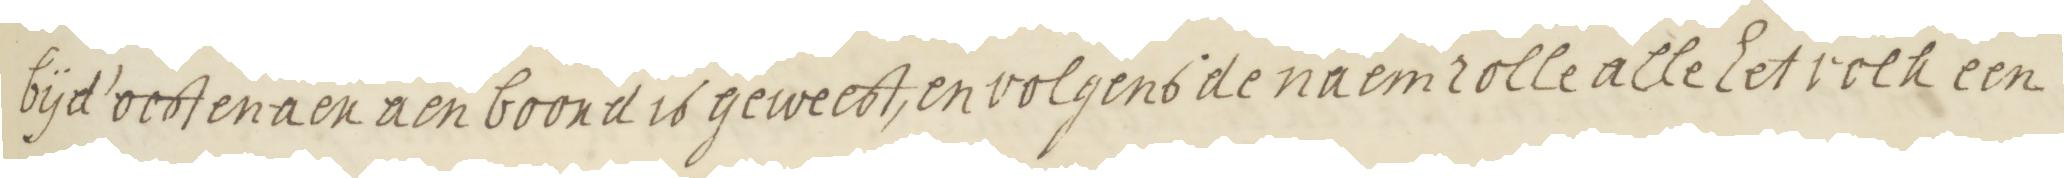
bij d’ oostenaer aen boord is geweest, en volgens de naem rolle alle het volk een
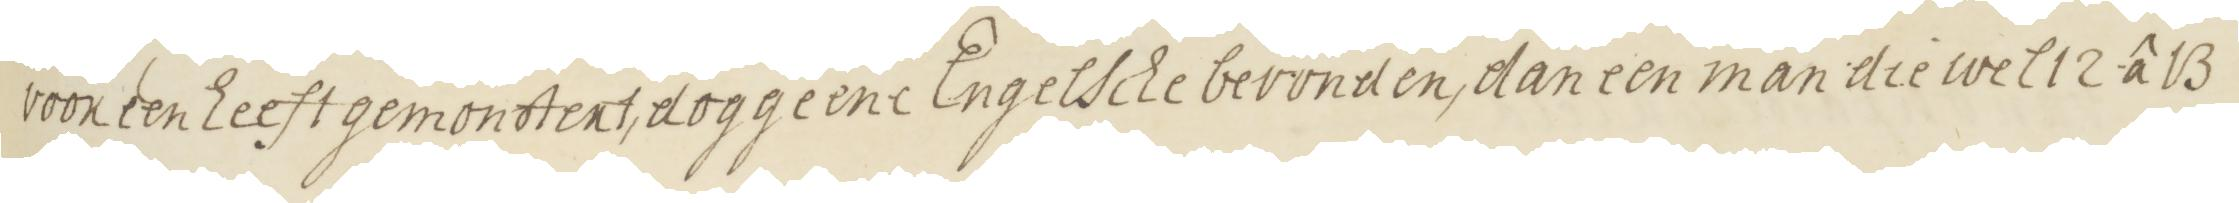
voor een heeft gemonstert, dog geene Engelsche bevonden, dan een man die wel 12 â 13
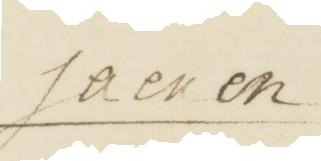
Jaer en
